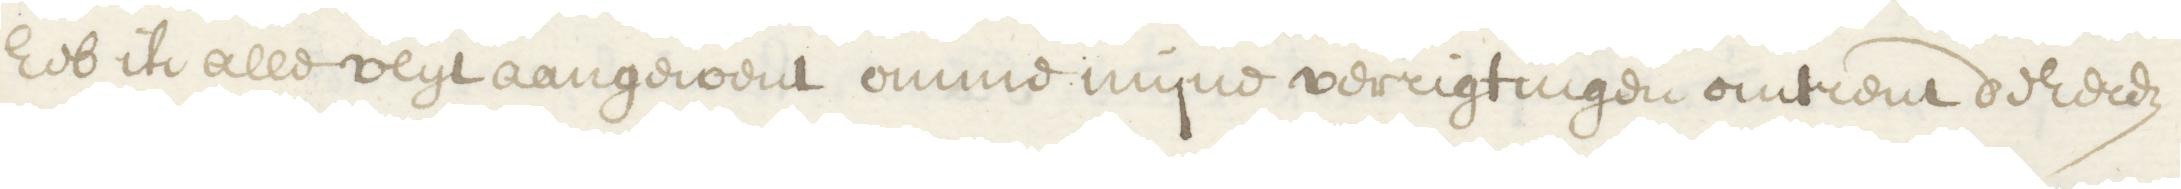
heb ik alle vlijt aangewent omme mijne verrigtingen omtrent deheren
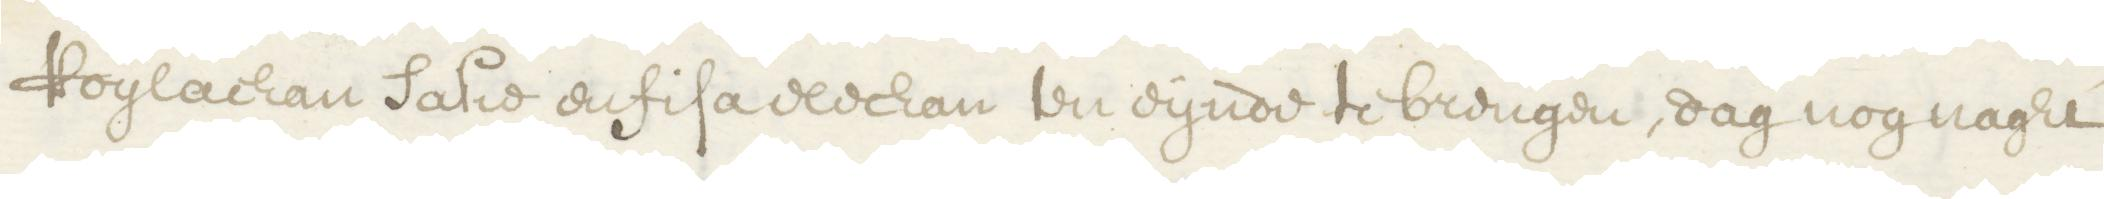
Poijlachan sasie en fisaelechan ten eijnde te brengen, dag nog naght
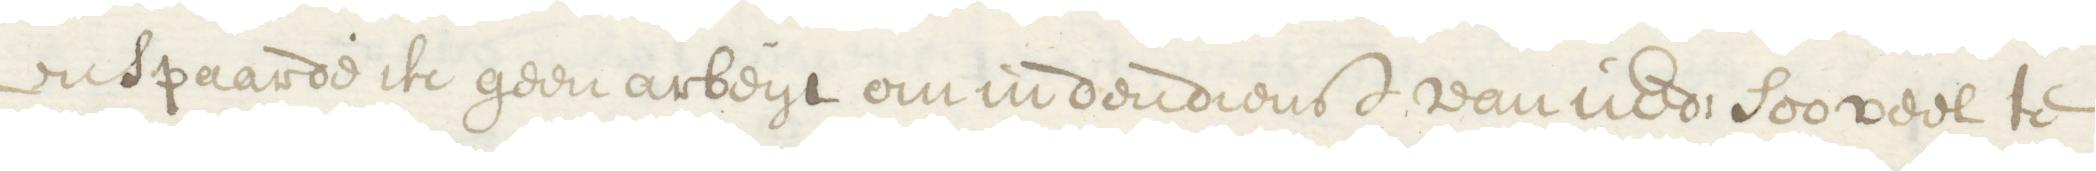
en spaarde ik geen arbeijt om in den dienst van uEd: soo veel te
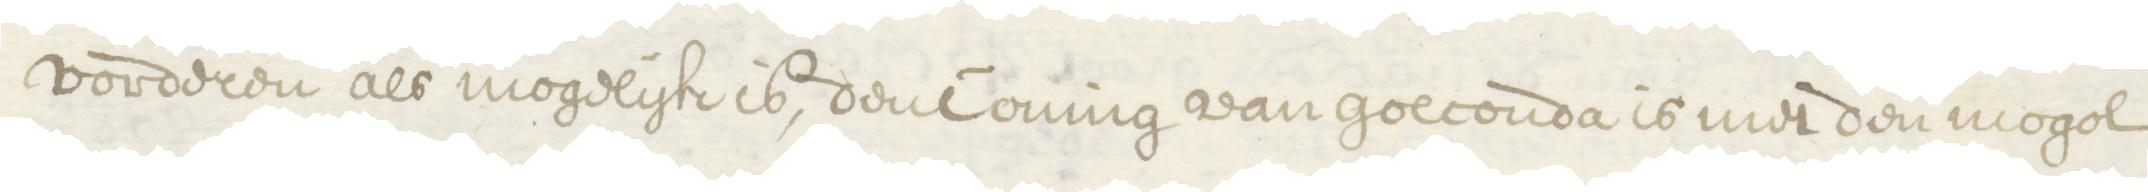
vorderen als mogelijk is, den Coning van goeconda is met den mogol
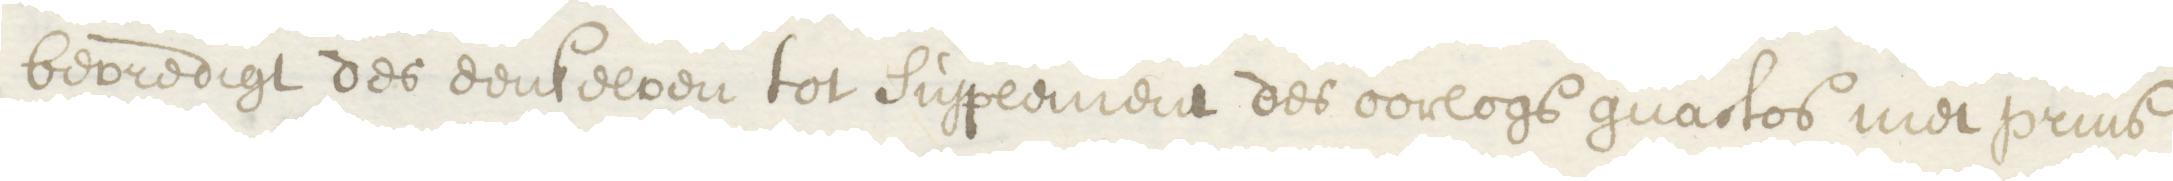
bevredigt des denselven tot supplement des oorlogs guastos met prins
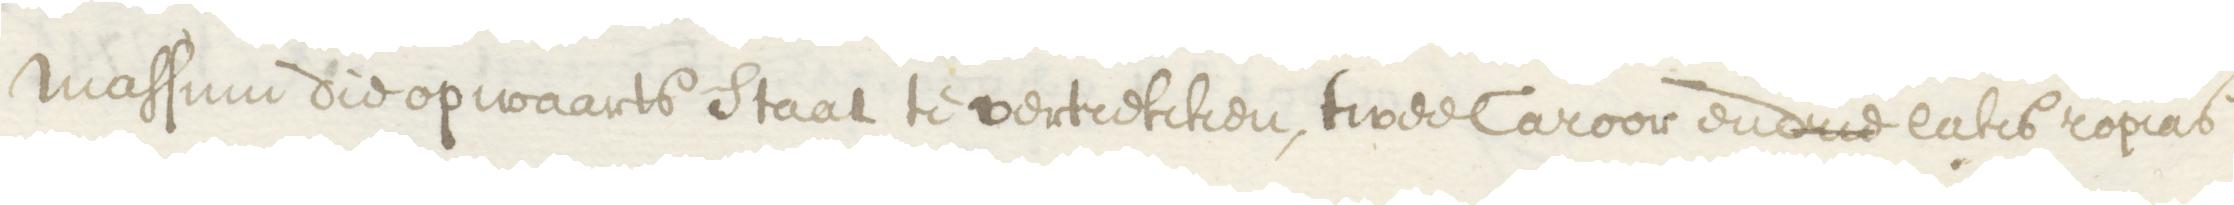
massum die op waarts staat te vertrekken, twee Caroor en drie 30: laks ropias
